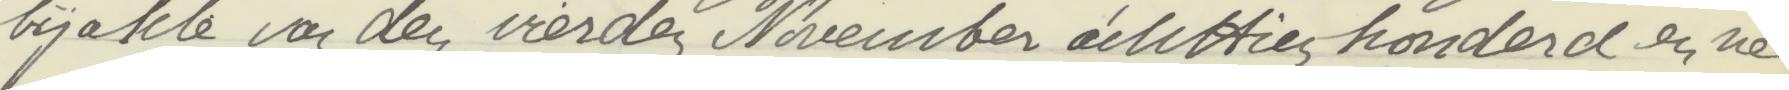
bij akte van den vierden November achttien honderd en ne
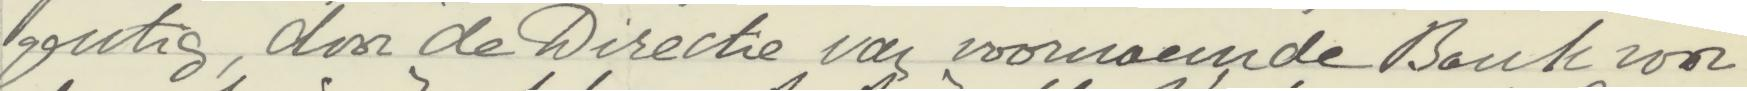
gentig, door de Directie van voornoemde Bank voor
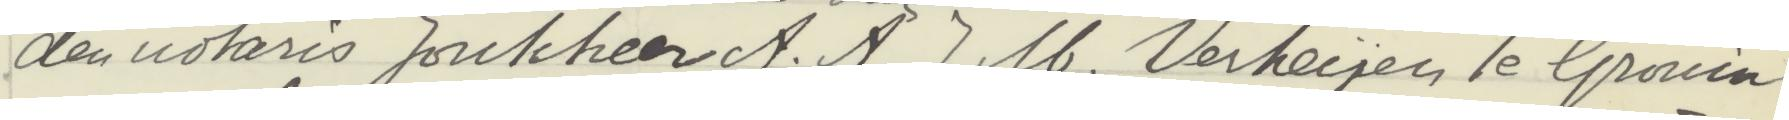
den notaris Jonkheer A. A. J. M. Verheijen te Gronin
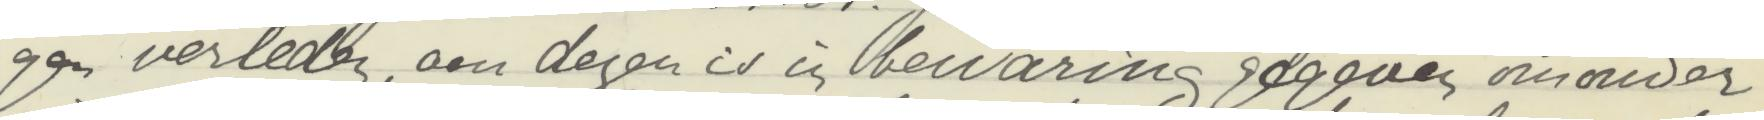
gen verleden, aan dezen is in bewaring gegeven om onder
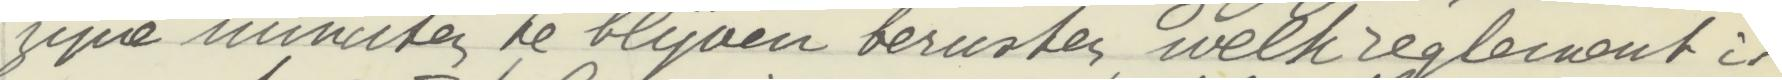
zijne minuten te blijven berusten, welk reglement is
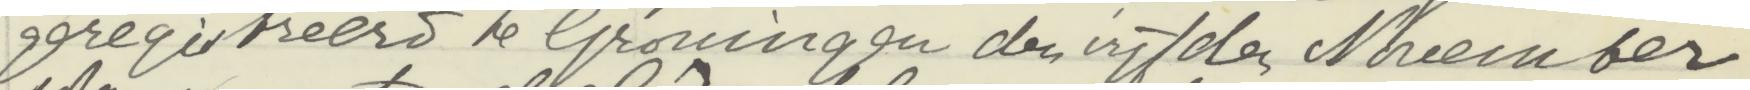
geregistreerd te Groningen den vijfden November
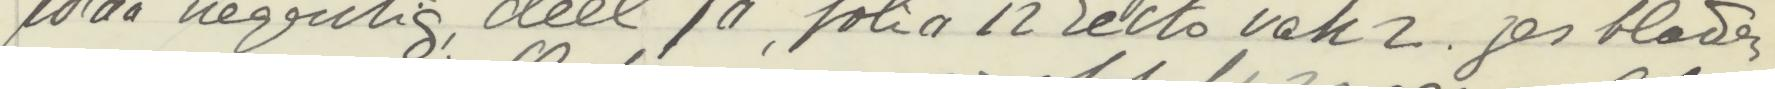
1800 negentig, deel 70, folio 12 recto van 2. zes bladen
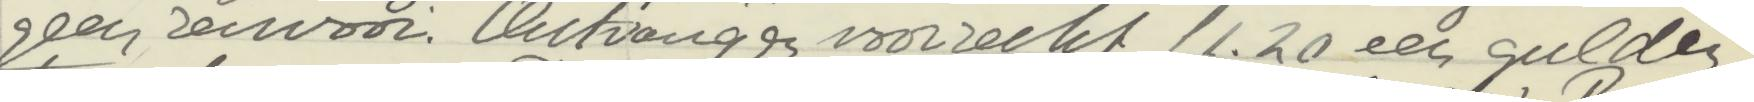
geen renvooi. Ontvangen voor recht ƒ1.20 een gulden
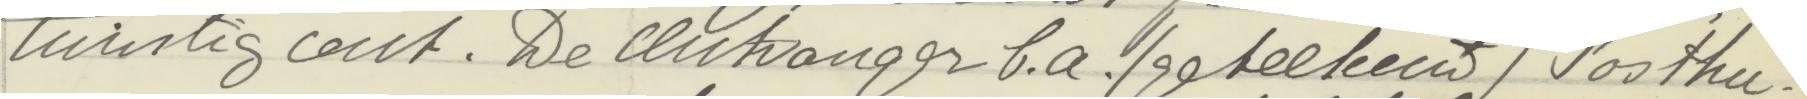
twintig cent. De Ontvanger b. a. (geteekend) Posthu-
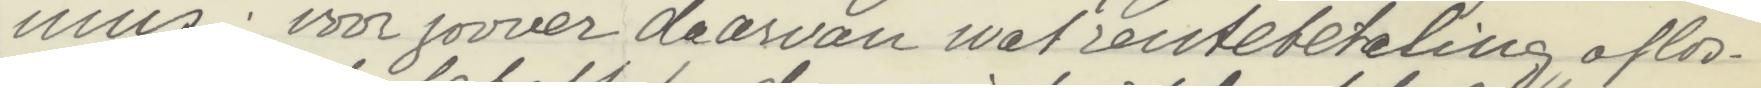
mus; voor zoover daar van met rentebetaling aflos-
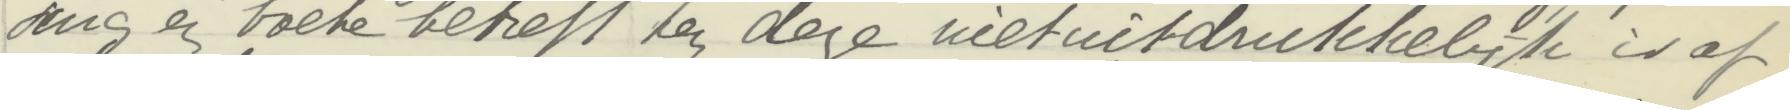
sing en boete betreft ten deze niet uitdrukkelijk is af
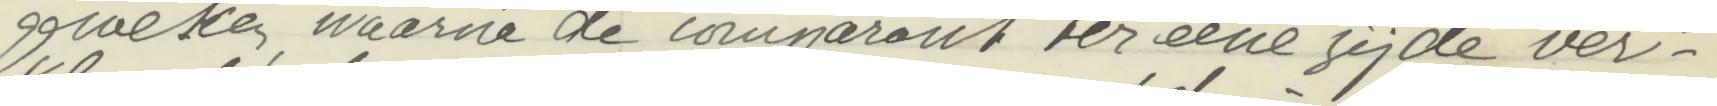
geweken waarna de comparant ter eene zijde ver-
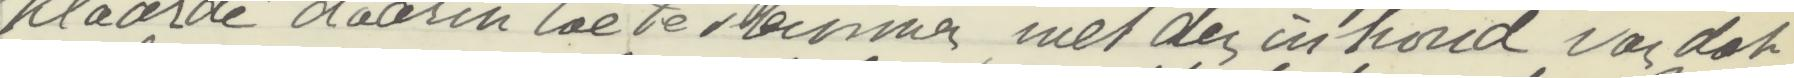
klaarde daarin toe te stemmen, met den inhoud van dat
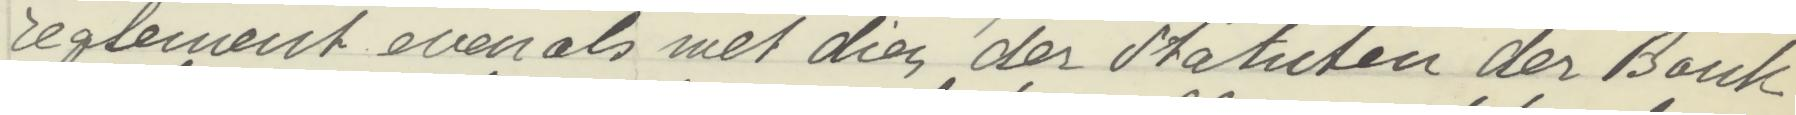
reglement even als met dien der statuten der Bank
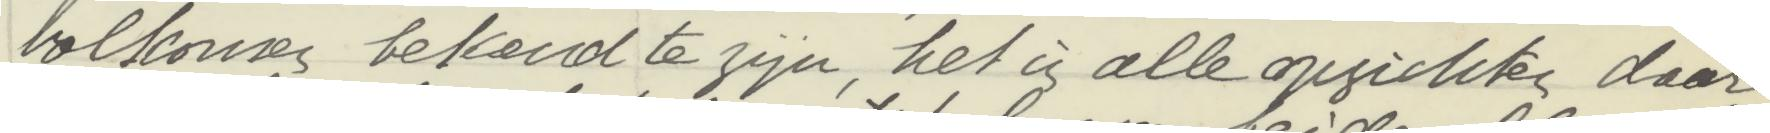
volkomen bekend te zijn, het in alle rechten daar
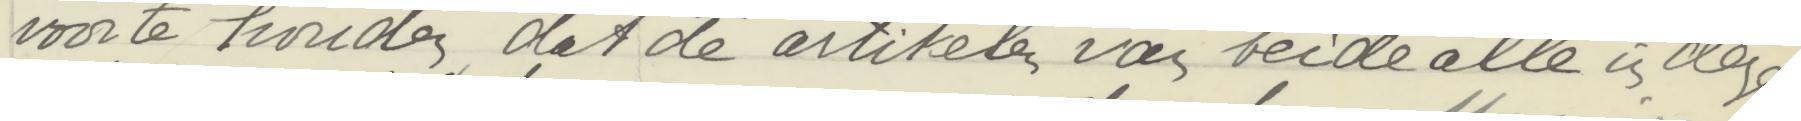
voor te houden, dat de artikelen van beide alle in deze
